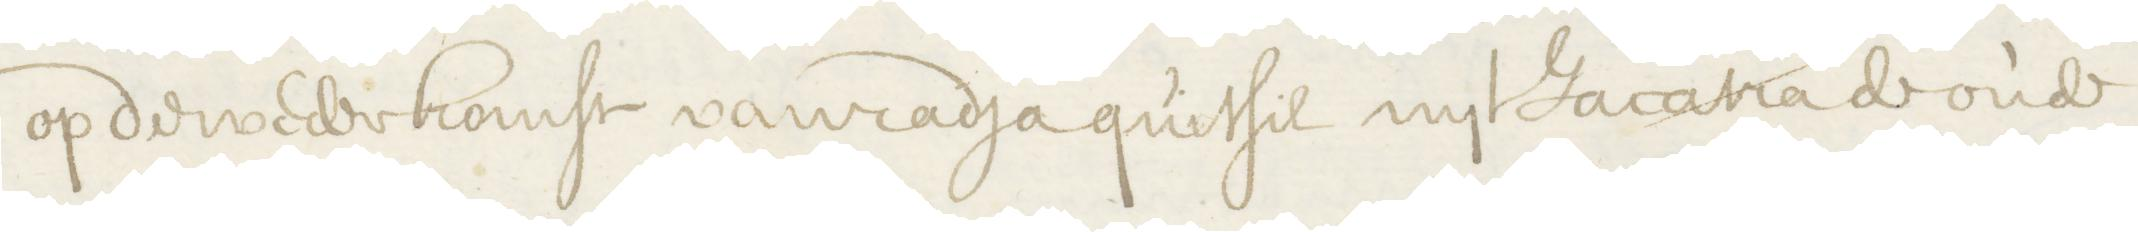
op de weder komst van radja quitsil uijt Jacatra de oude
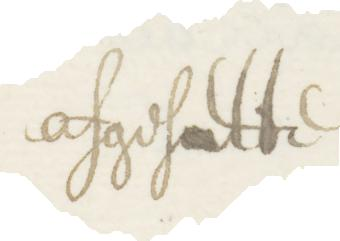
afgesette
